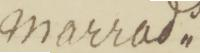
marrad„s
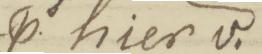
p.s hier v.
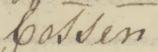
bossen
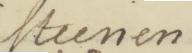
steenen
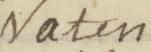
Vaten
